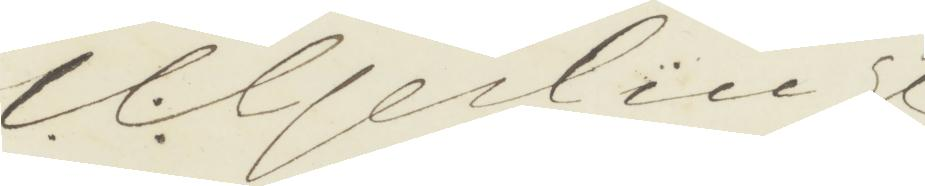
IC: Gerlings
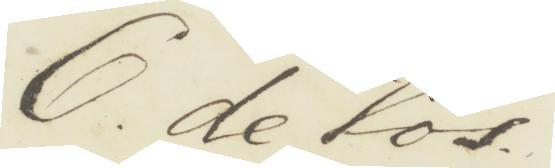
C. de Vos.
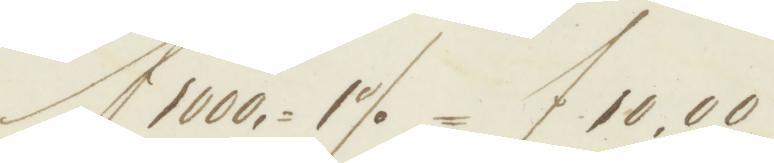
ƒ 1000.= 1% = ƒ 10,00
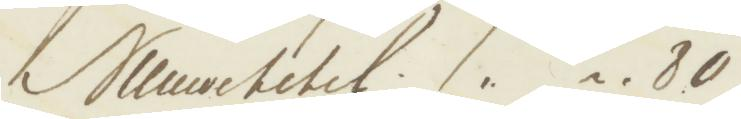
Nieuwe titel. „ „.80
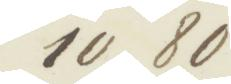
ƒ 10, 80
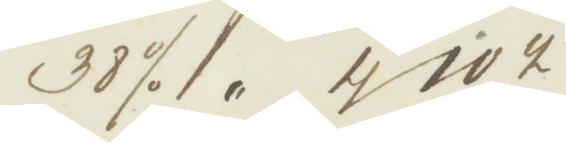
38% „ 4 10%
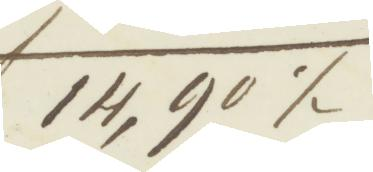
ƒ14,90%
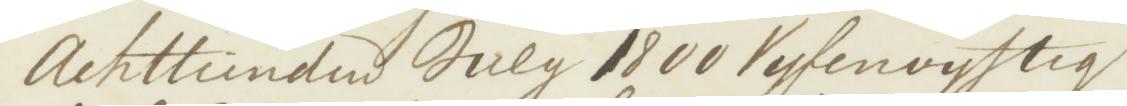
Achttienden July 1800 Vyfenvyftig
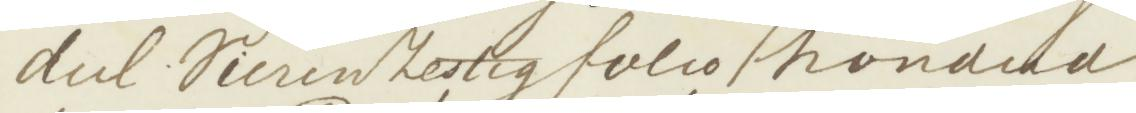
deel Vieren Zestig folio honderd
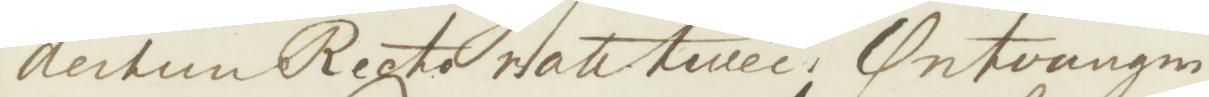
dertien Recto vak twee, Ontvangen
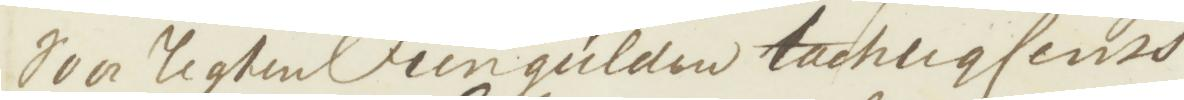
Voor Regten Tien gulden tachtig Cents
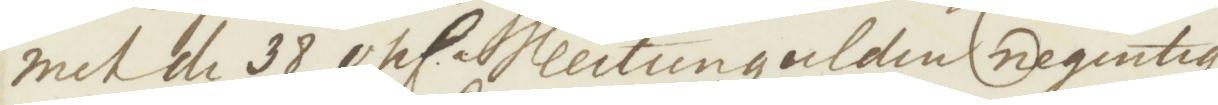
met de 38 opc Veertien gulden negentig
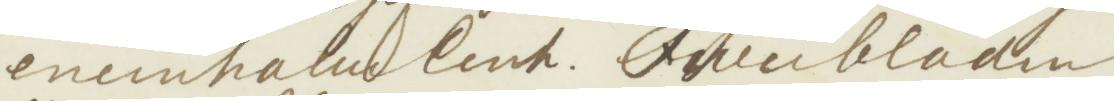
en een halve Cent. Twee bladen
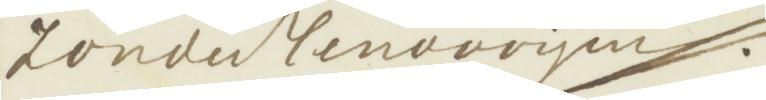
zonder renvooijen.
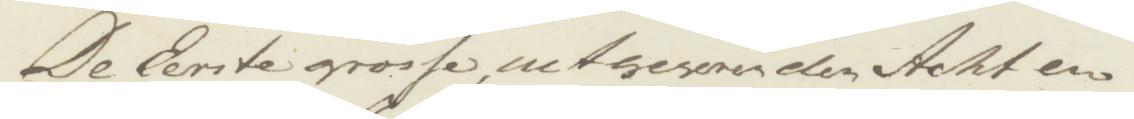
De Eerste grosse, uitgegeven den Acht en
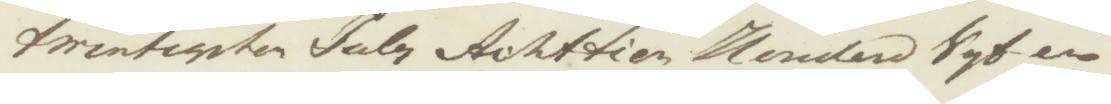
twintigsten July Achttien Honderd Vyf en
